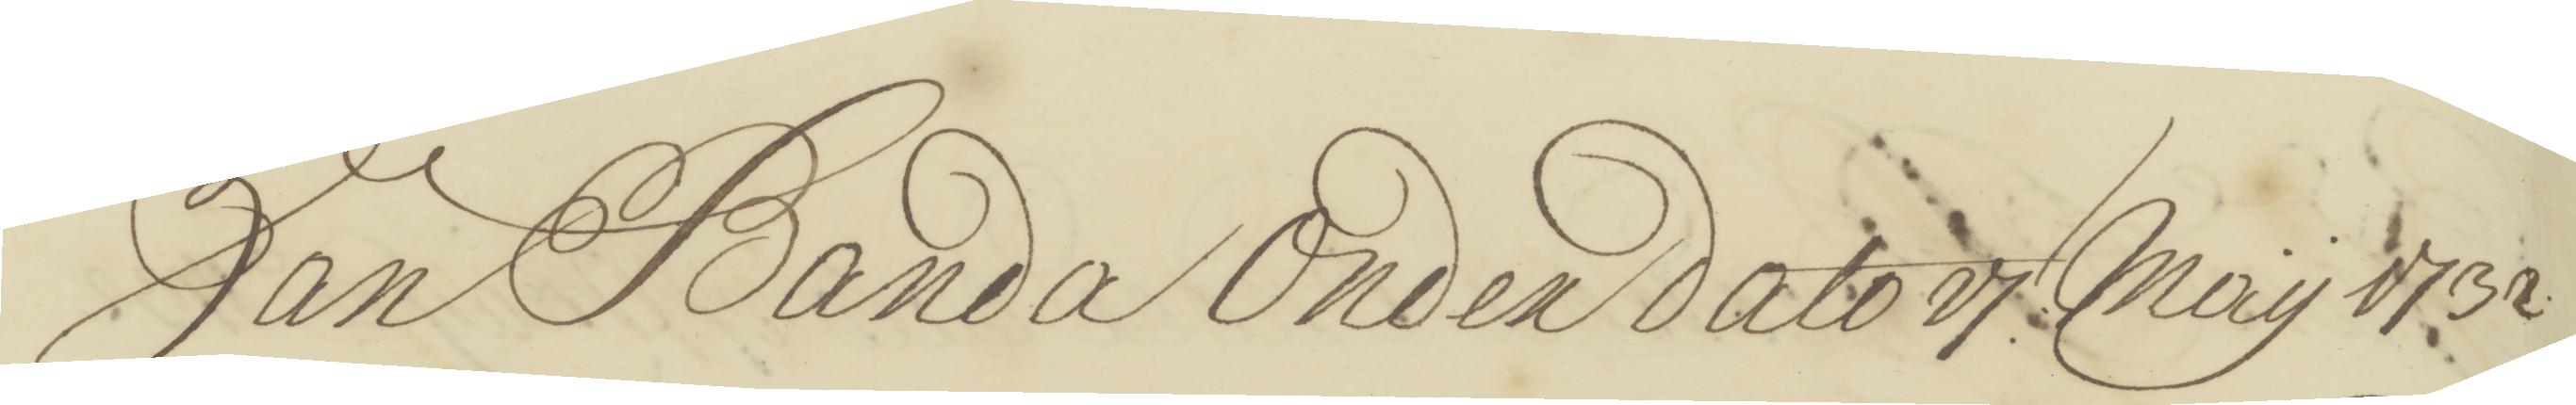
Van Banda onder dato 27: Maij 1732
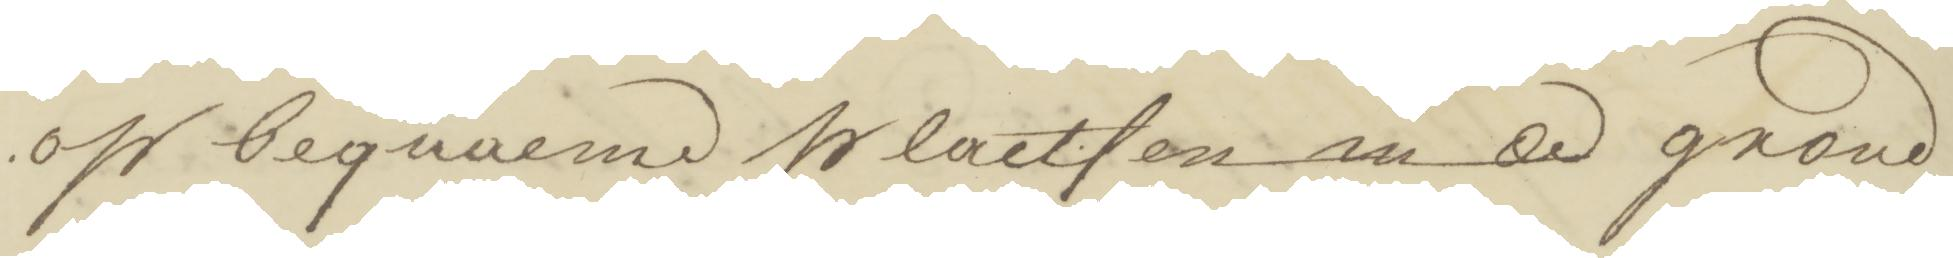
op bequaeme plaetsen in de grond
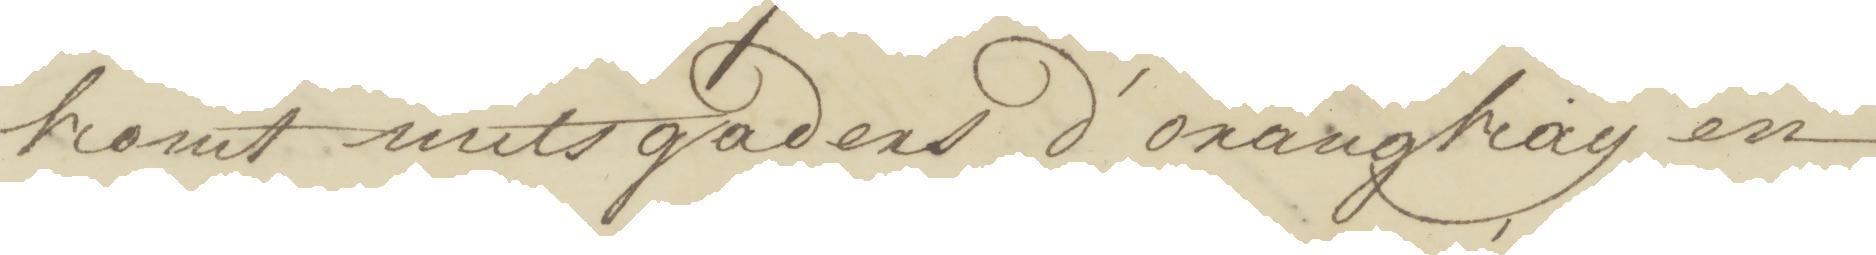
komt mitsgaders d’ orangkaij en
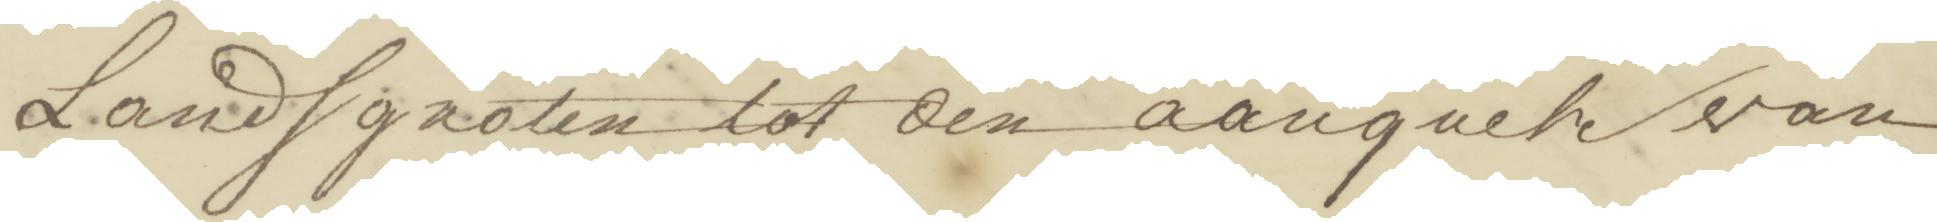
Landsgroten tot den aanquek van
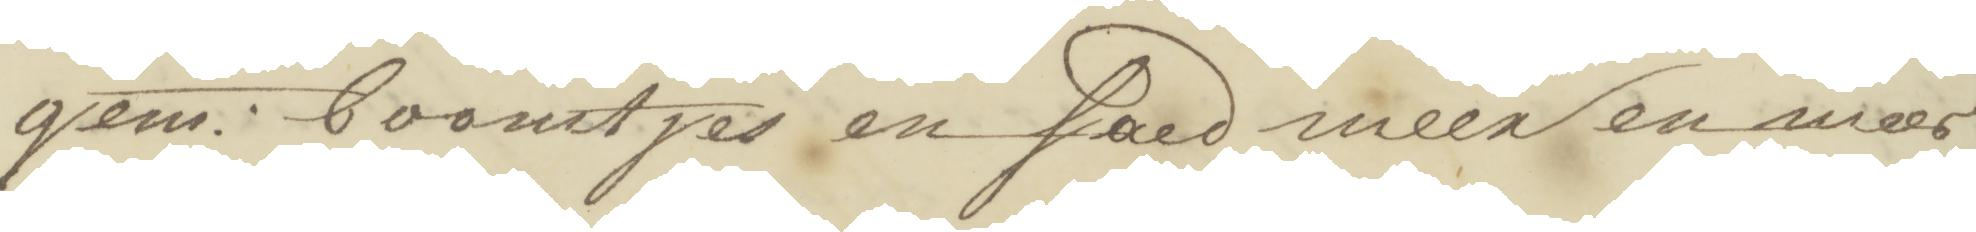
gem: boomtjes en saed meer en meer
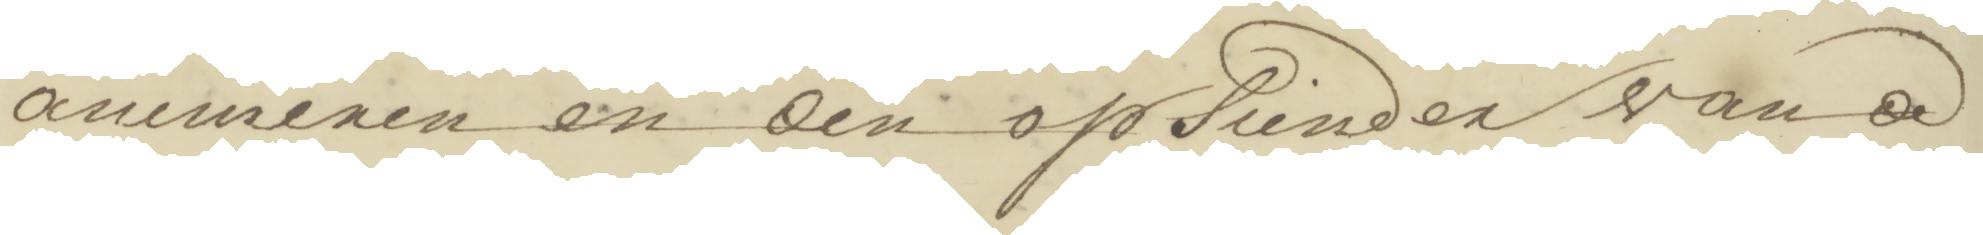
animeren en den opsiender van de
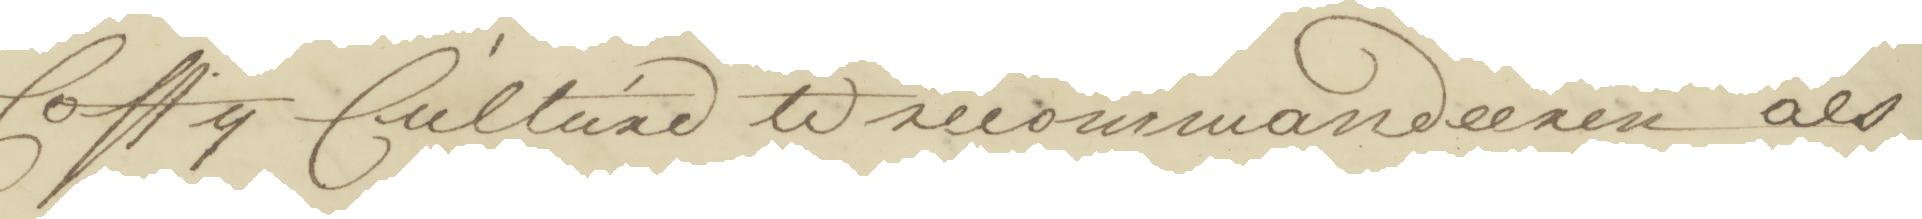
Coffij Culture te recommandeeren als
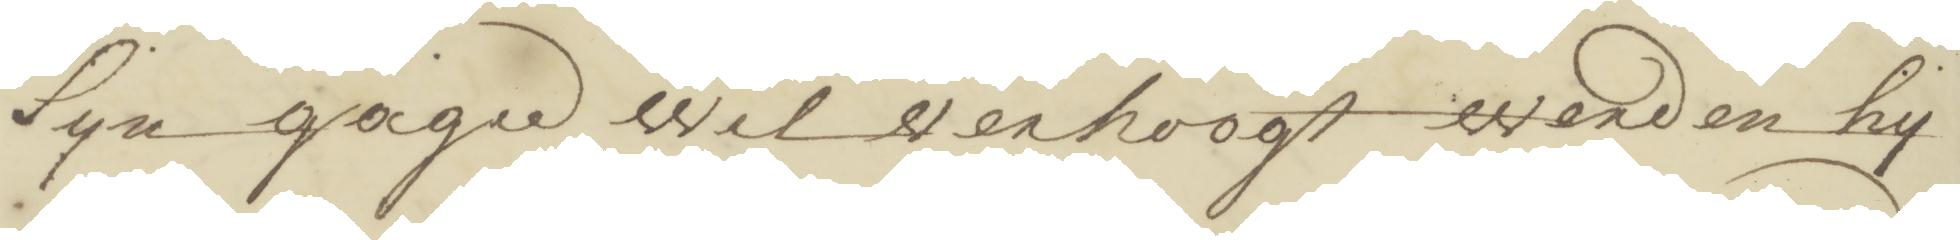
Sijn gagie wil verhoogt werden hij
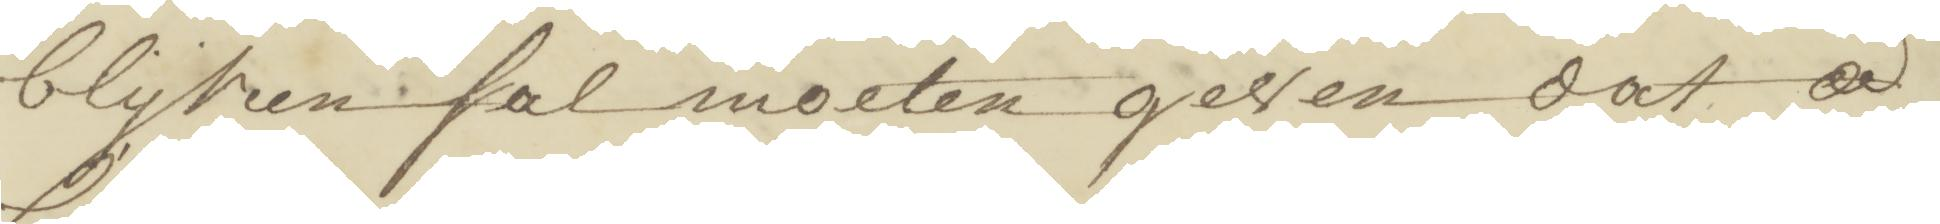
blijken sal moeten geven dat de
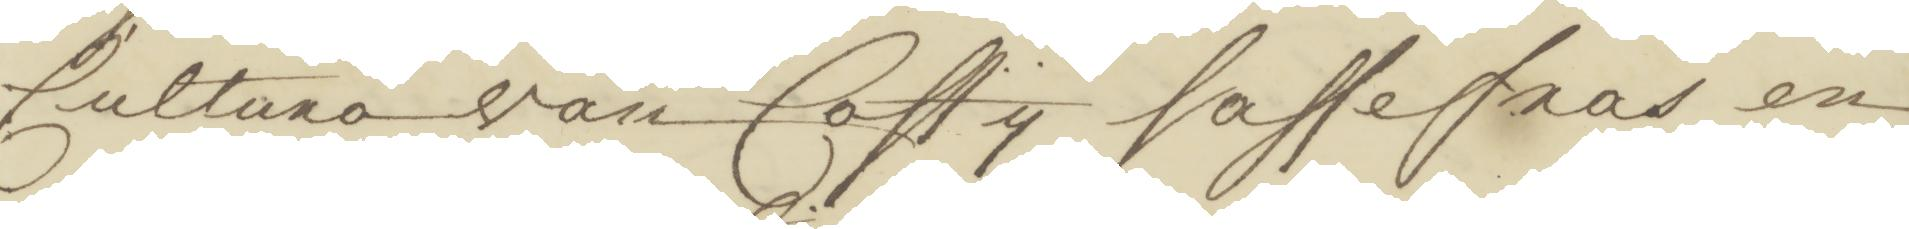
Culture van Coffij Sassefras en
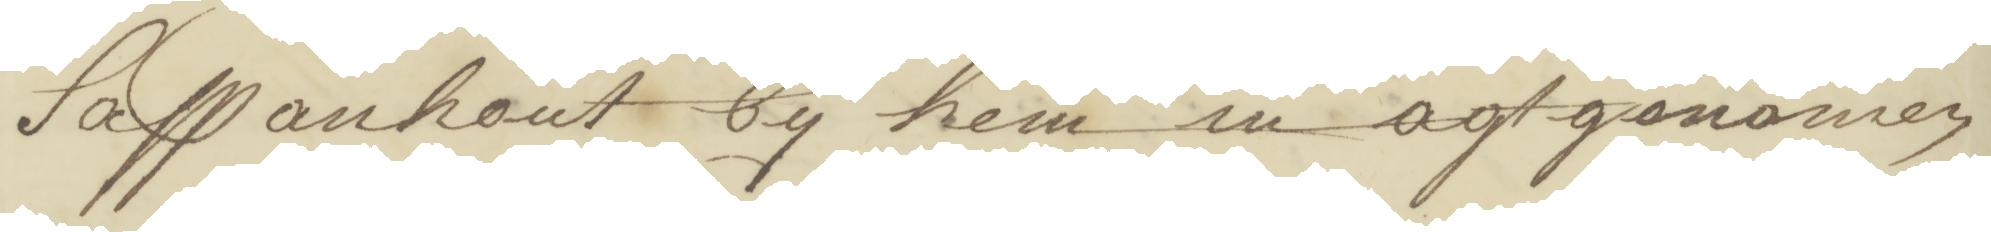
Sappanhout, bij hem in agt genomen
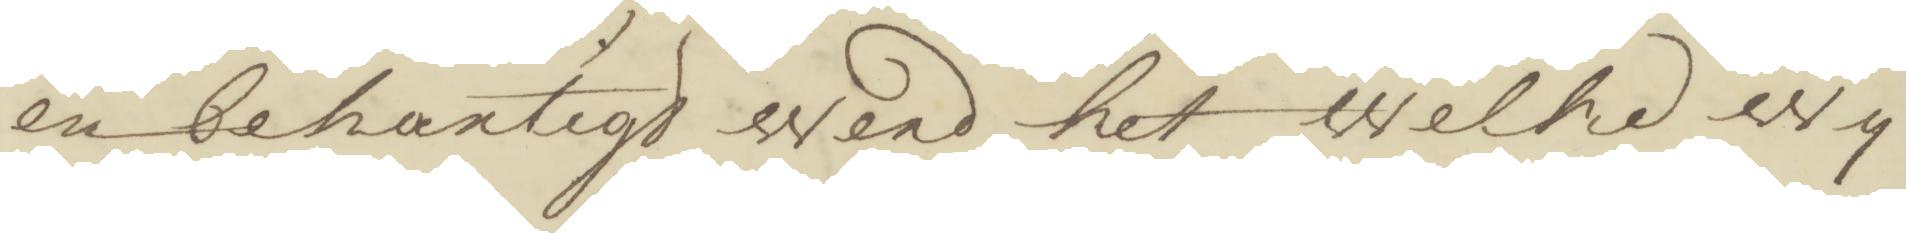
en behartigd werd, het welke wij
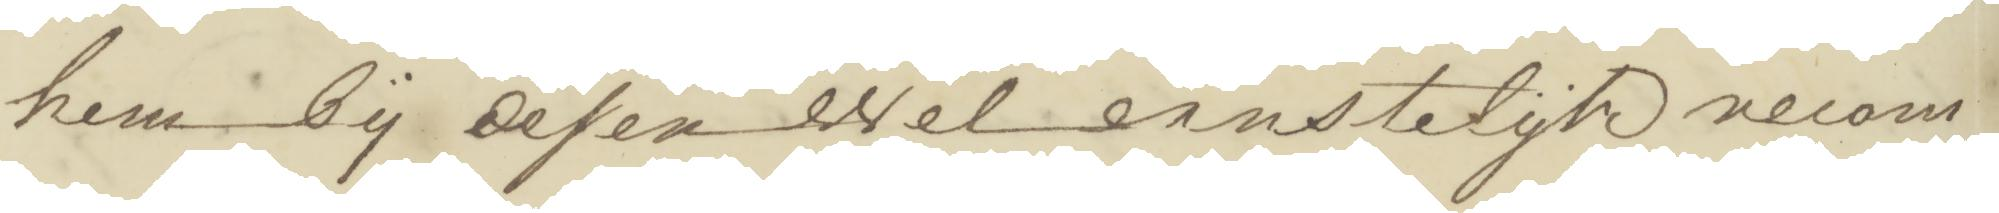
hem bij deser wel ernstelijk recom„
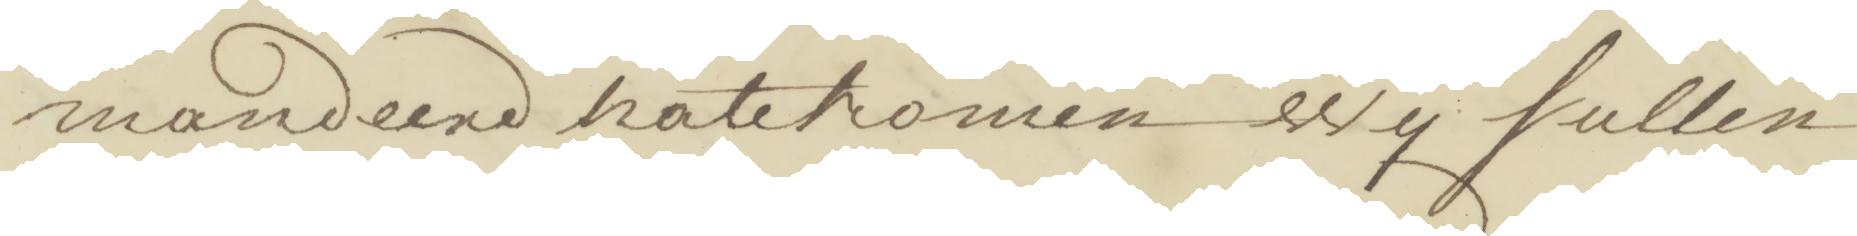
mandeere na te komen wij sullen
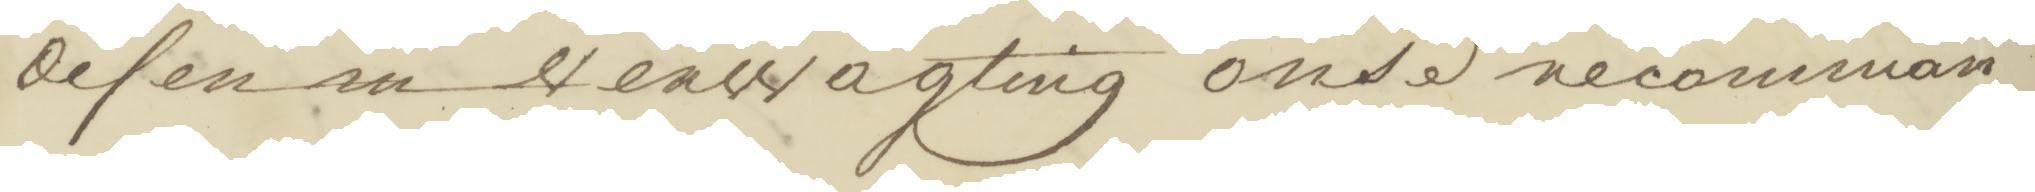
desen in verwagting onse recomman„
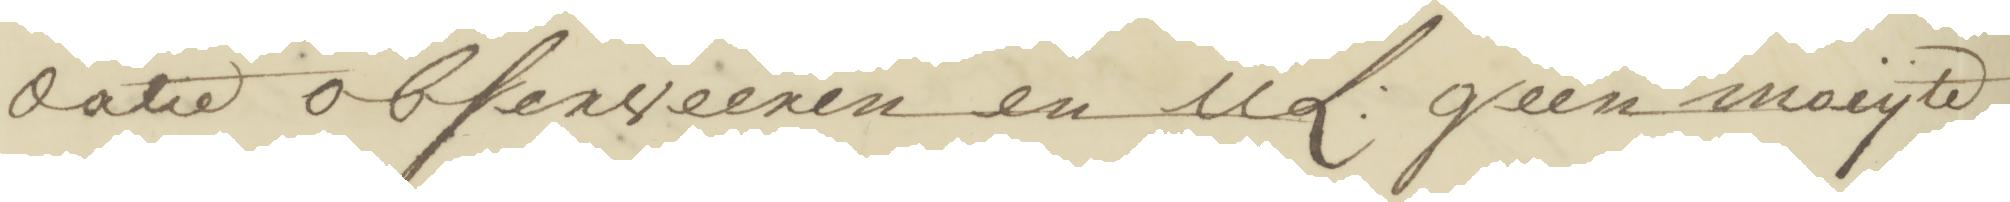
datie observeeren en uL: geen moeijte
